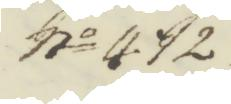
N=o 472
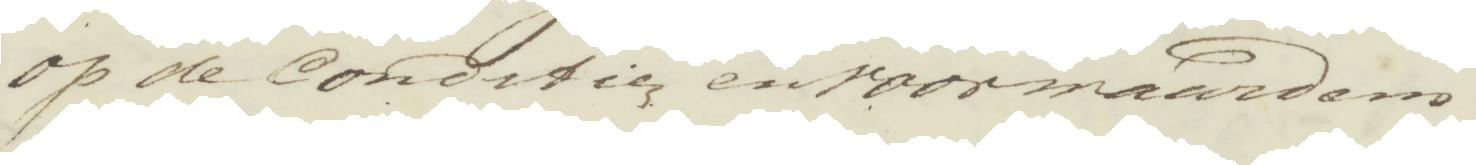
op de conditien en voorwaarden
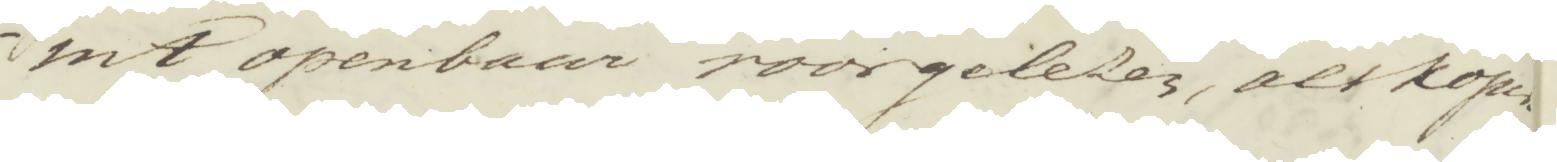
in t openbaar voorgelezen, als koper
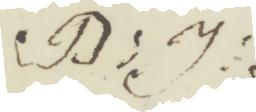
D: J:
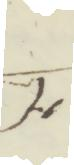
Fr
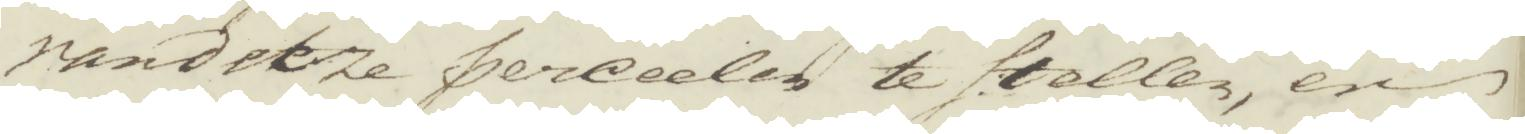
van deeze perceelen te stellen, en
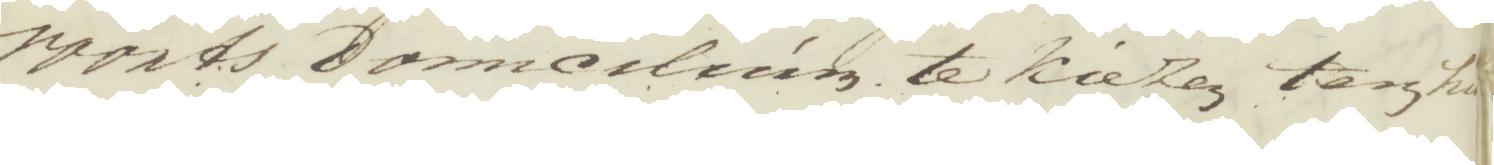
voorts domicilium, te kiezen ten ha
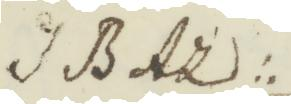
J B Az:.
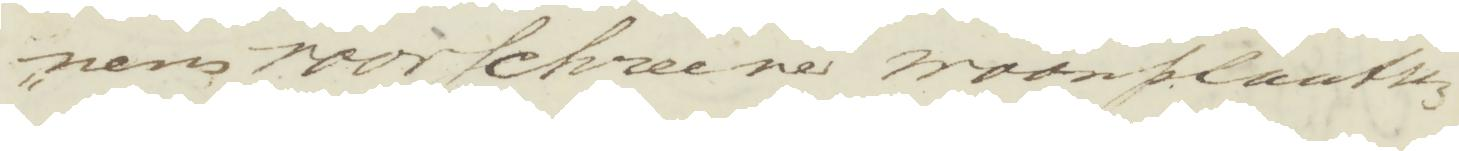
„nem voorschreeve woonplaatsen
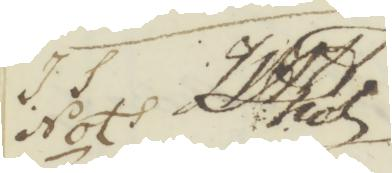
Nots JWnot
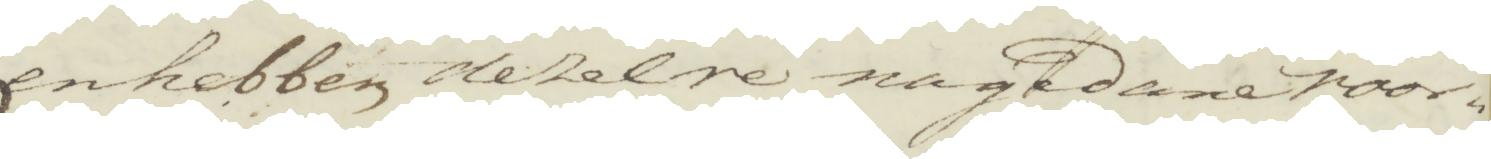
en hebben dezelve nagedane voor„
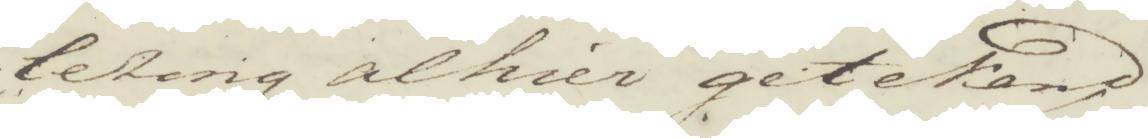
lezing alhier getekend.
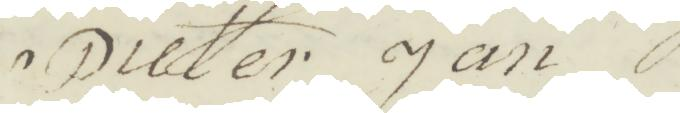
Pieter Jan
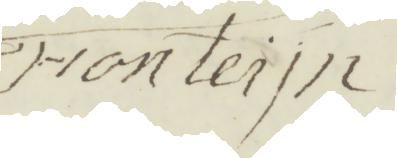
Fionteijn
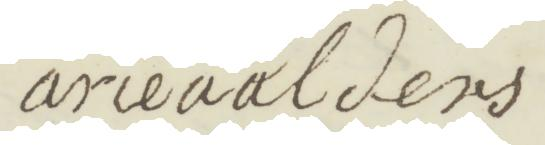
arie aalders
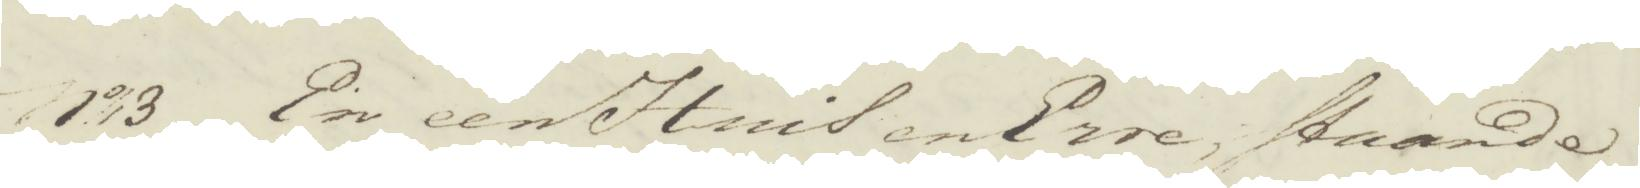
N„o 3 En een Huis en Erve, staande
